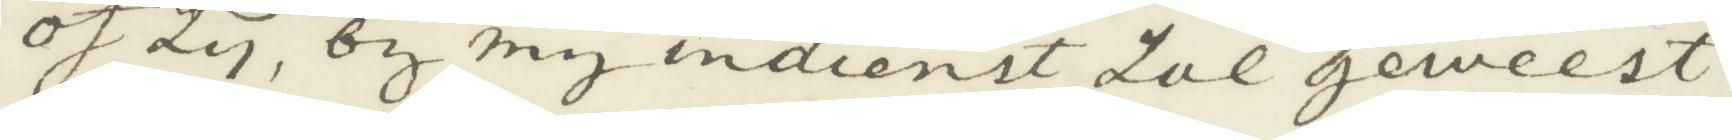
of zy, by my in dienst zal geweest
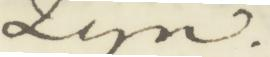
zyn.
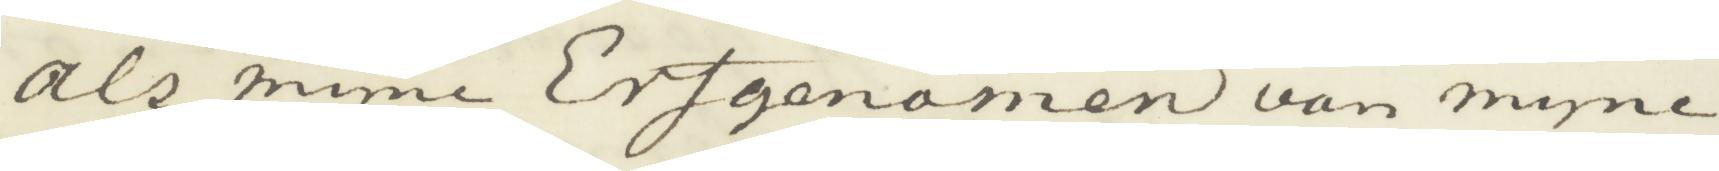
Als myne Erfgenamen van myne
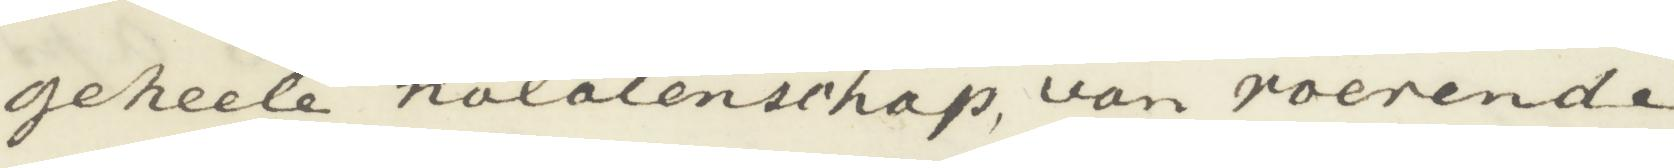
geheele nalatenschap, van roerende
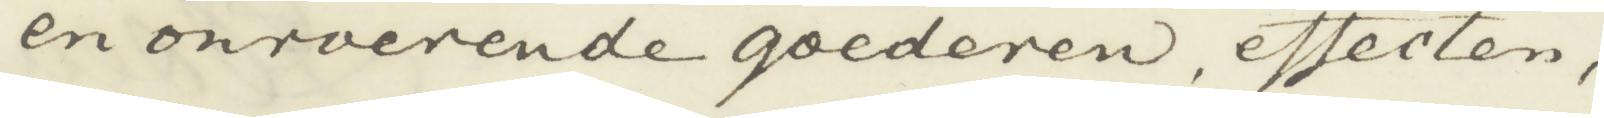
en onroerende goederen, effecten,
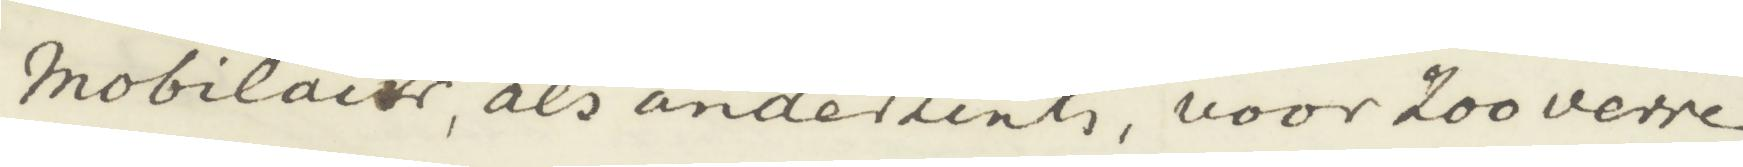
mobilair, als anderzints, voor zoo verre
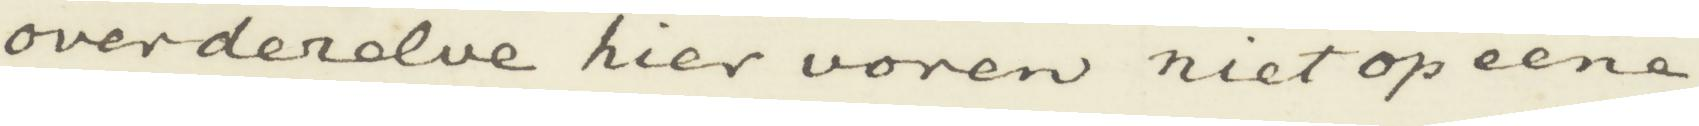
over dezelve hier voren niet op eene
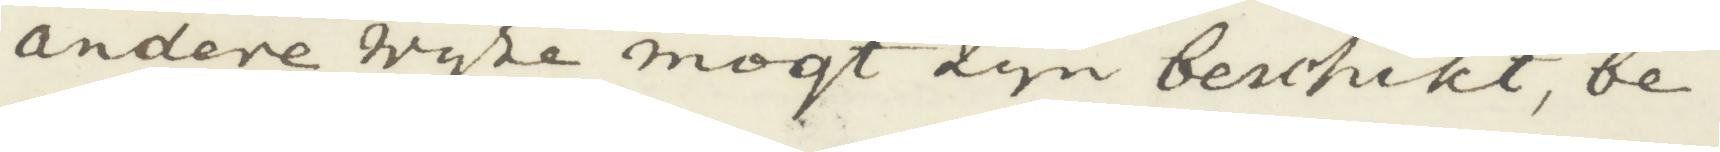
andere wyze mogt zyn beschikt, be
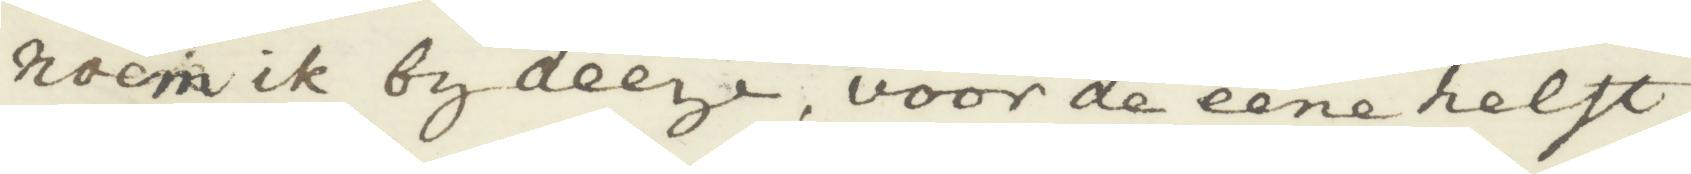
noem ik by deeze, voor de eene helft
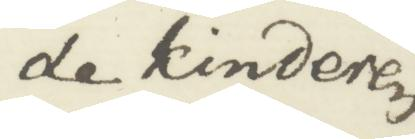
de kinderen
